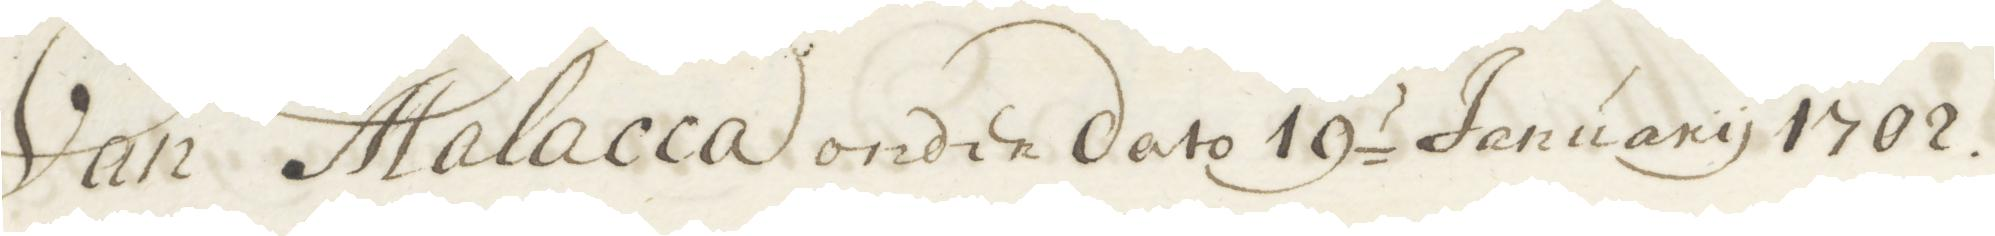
Van Malacca onder dato 19=' Ianuarij 1702.
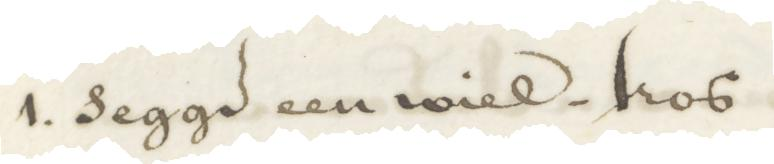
1. segge een wiel-tros
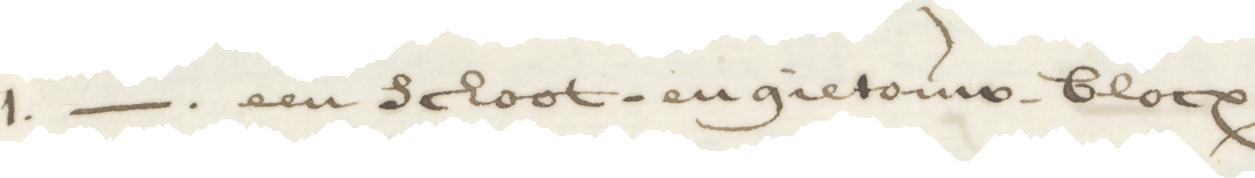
1. —. een schoot- en gietouw-blocx
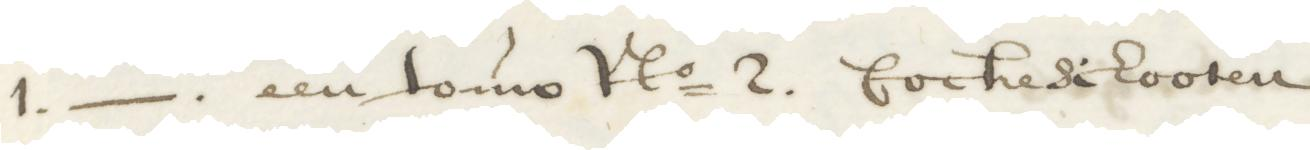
1. —. een touw N=o 2. bockeschooten
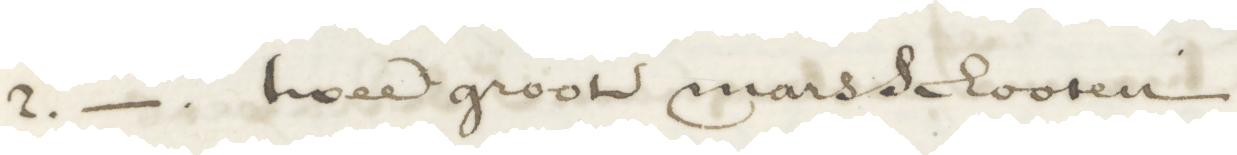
2. —. twee groote marsschooten
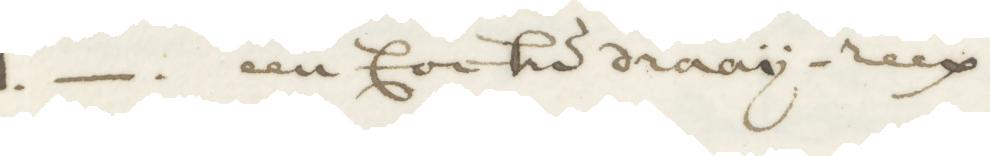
1. —. een Cocke draaij–reep
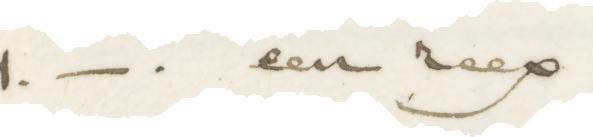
1. —. een reep
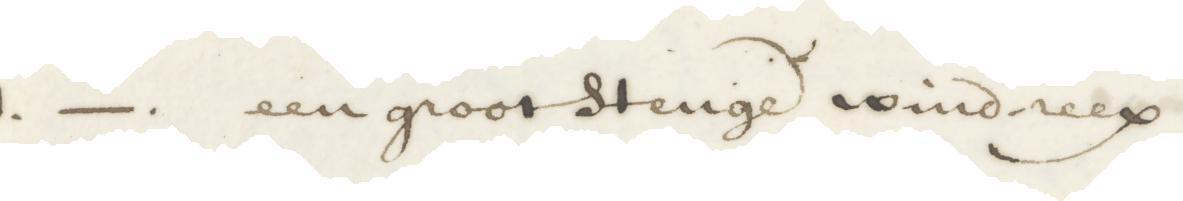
1.—. een groot stenge windreep
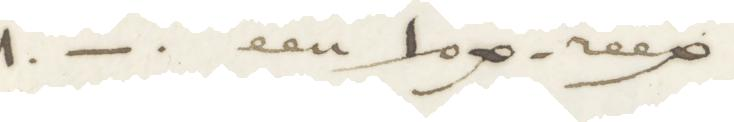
1. —. een top-reep
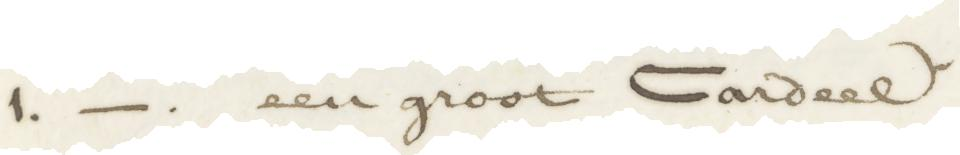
1. —. een groot Cardeel
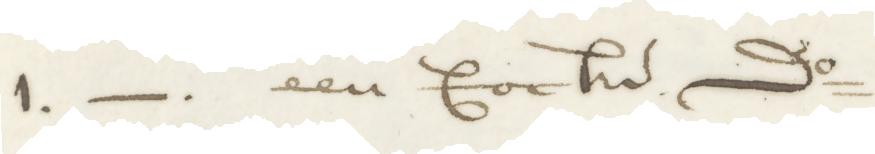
1. —. een Cocke D=o
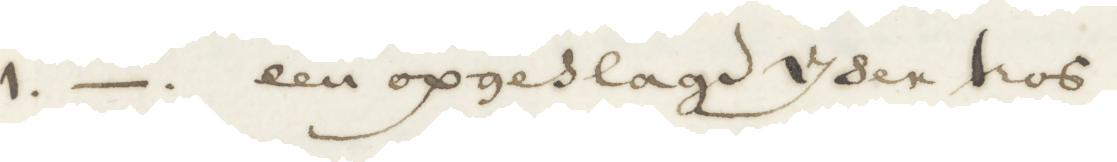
1. —. een opgeslage ijser tros
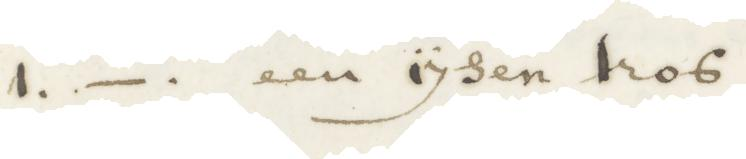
1. —. een ijser tros
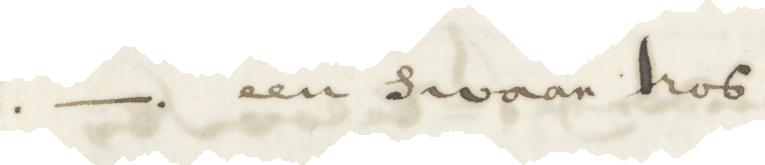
1.—. een swaar tros
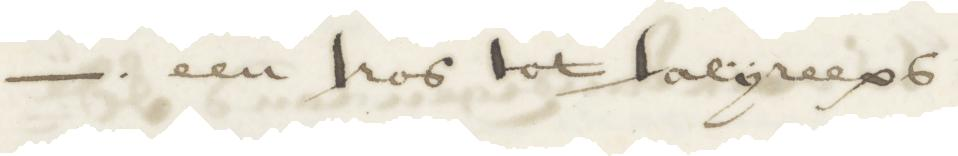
1.—. een tros tot talij reeps
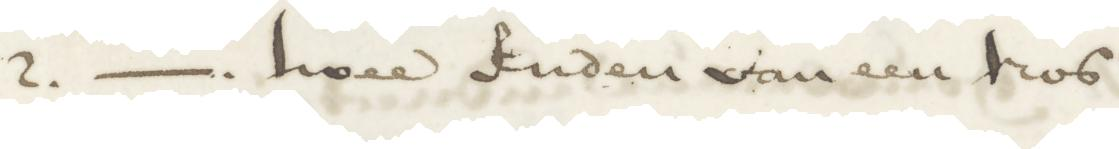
2. —. twee Enden van een tros
